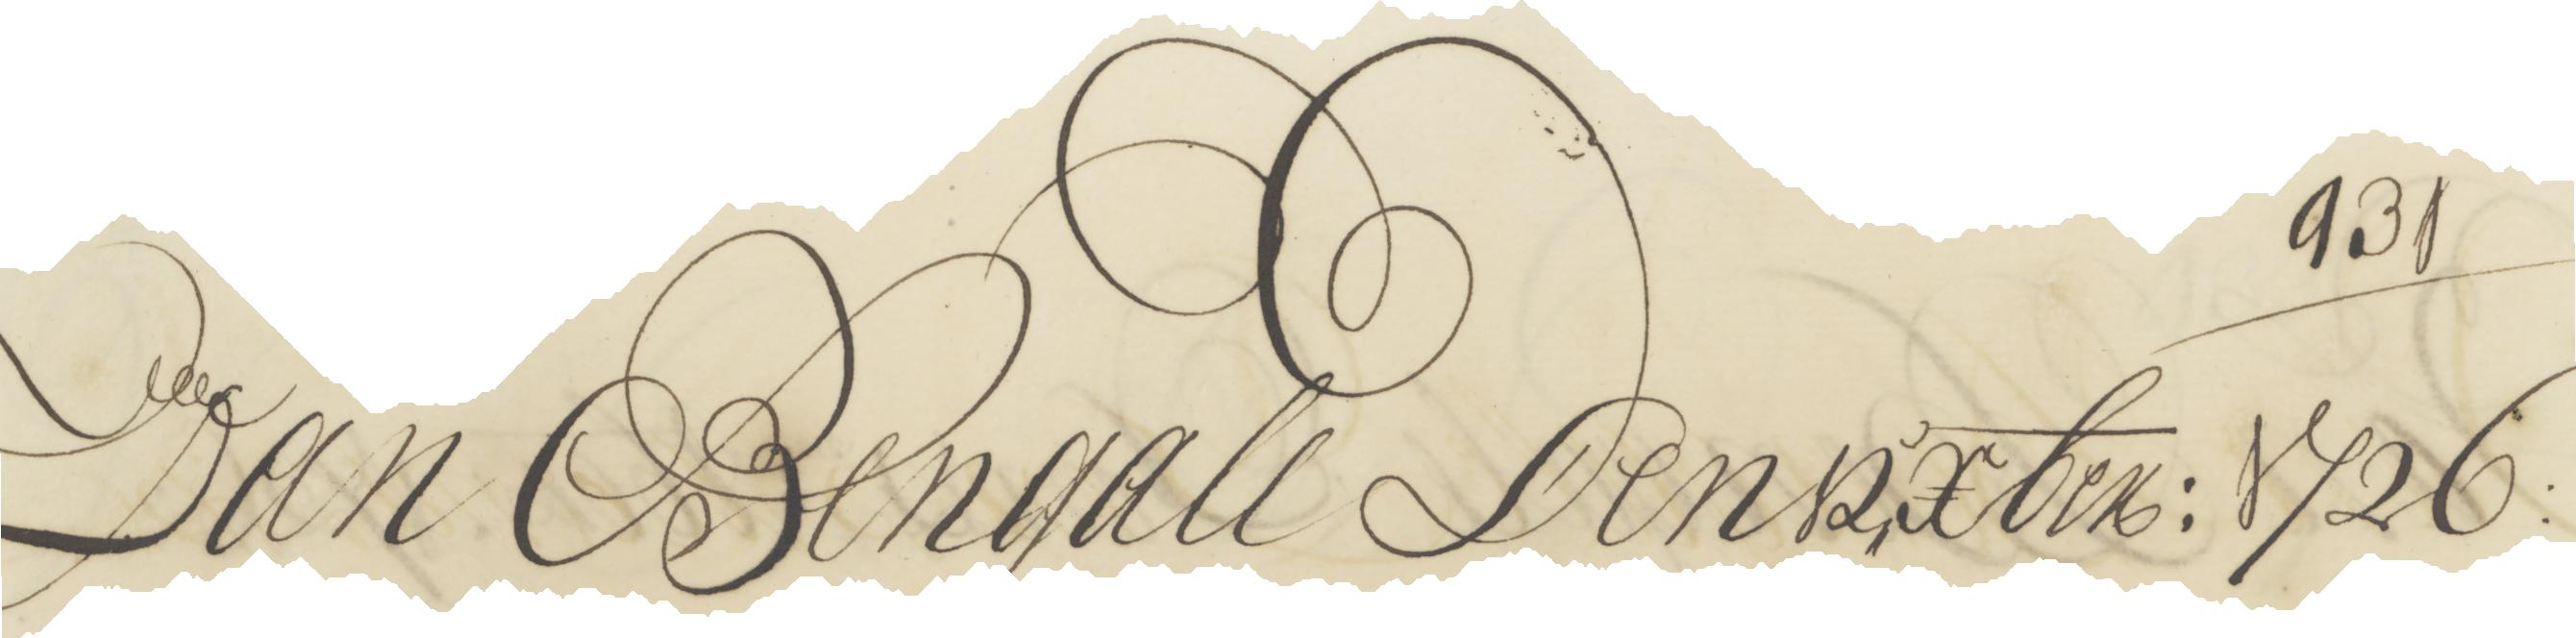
Van Bengale Den 12„ Xber: 1726:
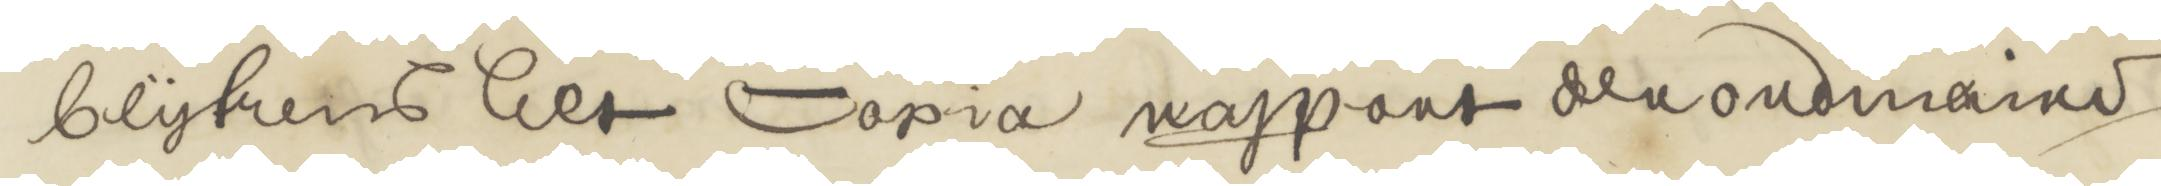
blijkens het Copia rapport der ordinaire
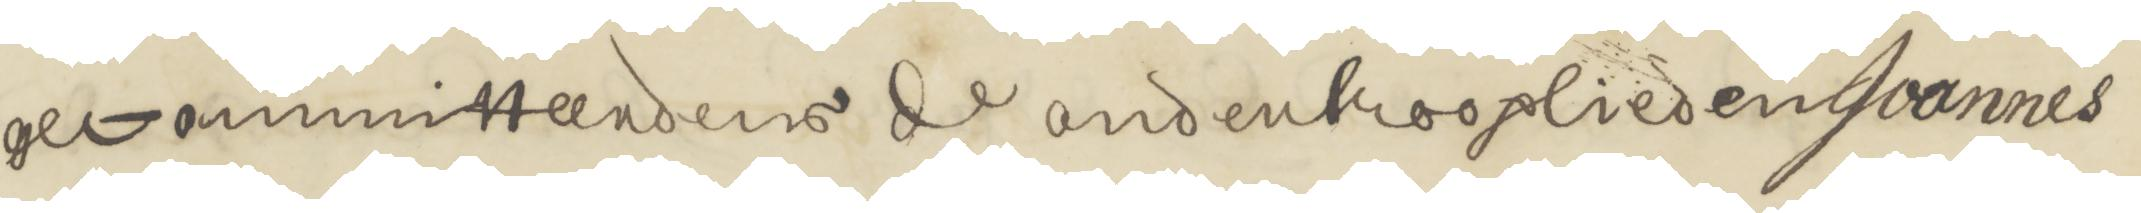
gecommitteerdens de onderkooplieden Joannes
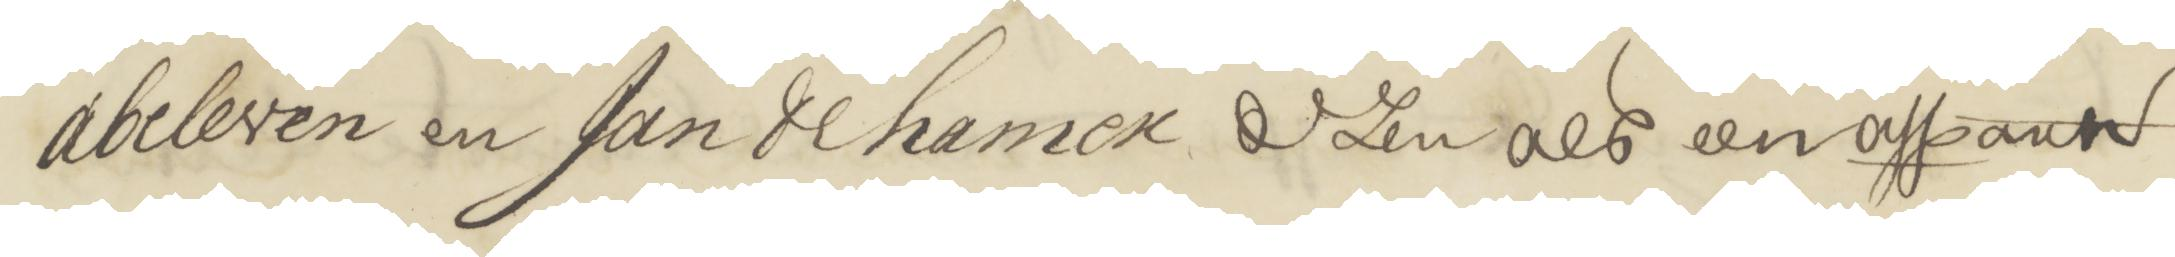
abeleven en Jan de hamer dezen als een apparte
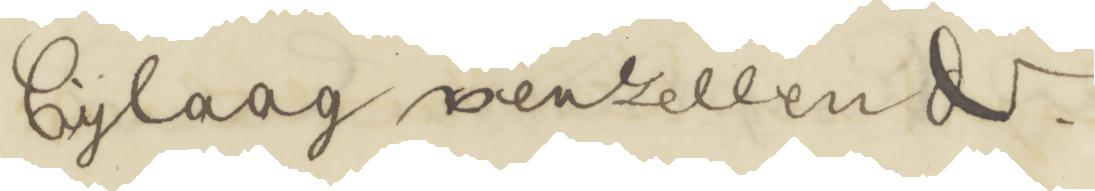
bijlaag verzellende.
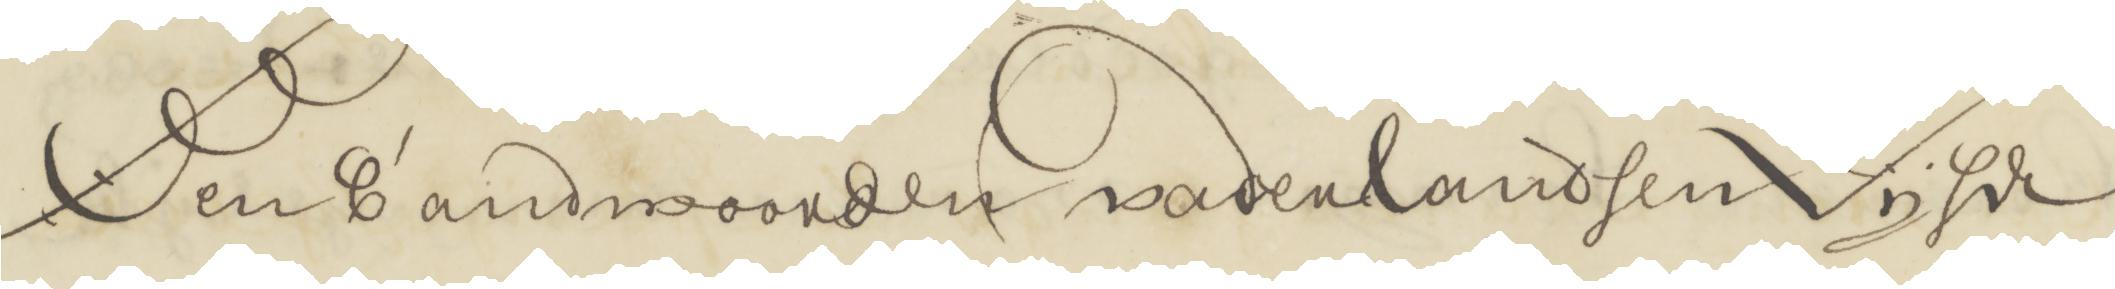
Den b'andwoorden vaderlandsen Eijsch
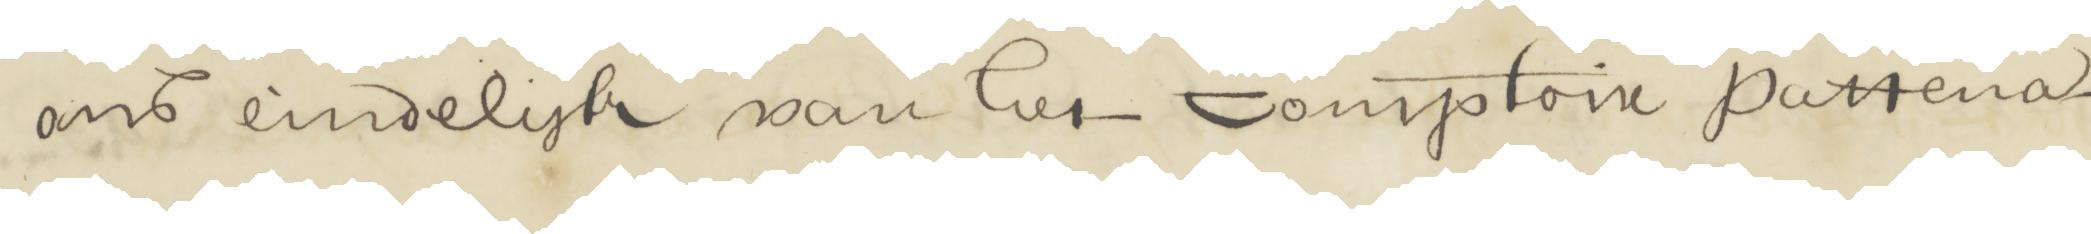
ons eindelijk van het Comptoir Pattena
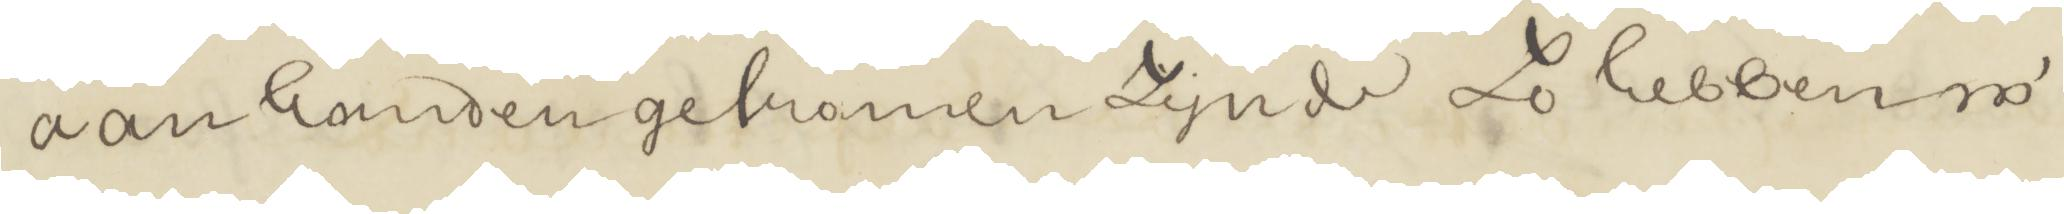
aan handen gekomen zijnde so hebben w'
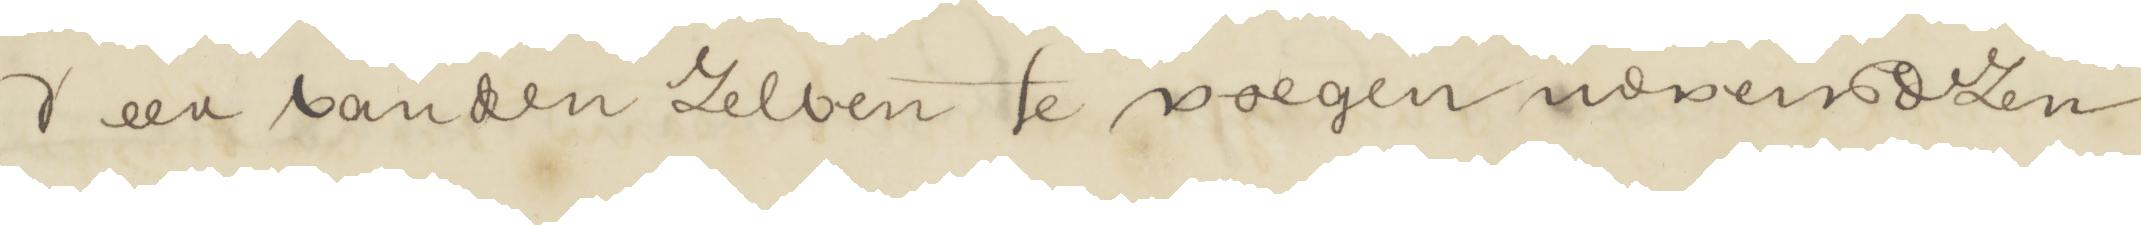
d’eer van den zelven te voegen nevens dezen
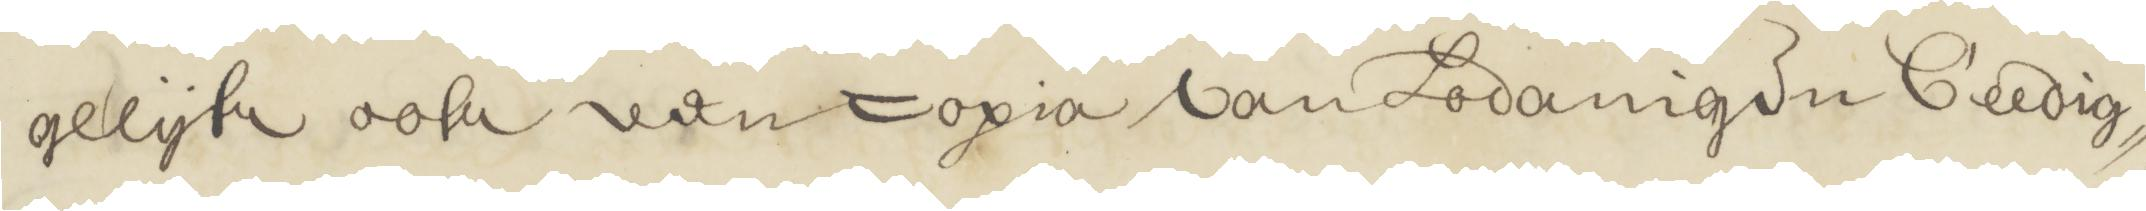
gelijk ook een copia van sodanigen b'eedig„
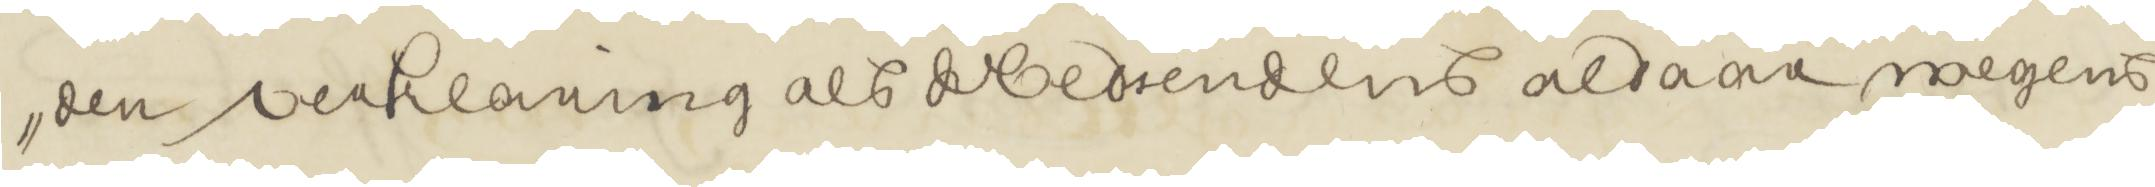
„den verklaring als de bediendens aldaar wegens
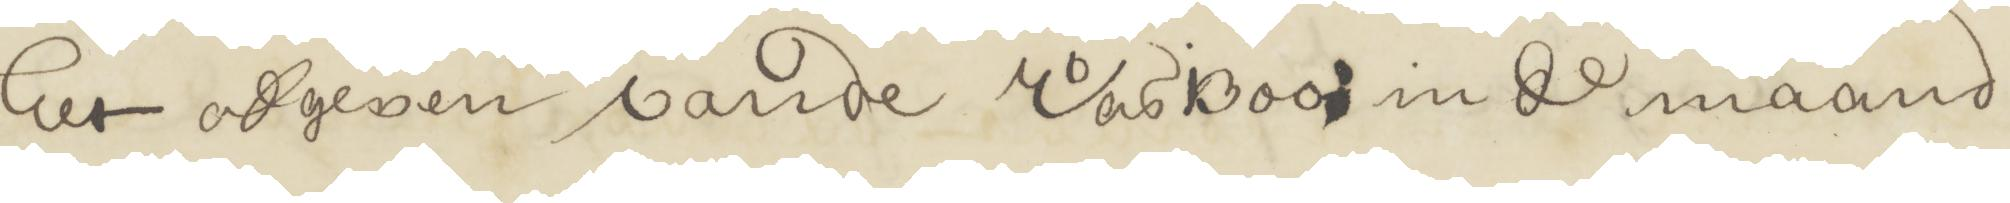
het afgeven vande r/oas 1300: in de maand
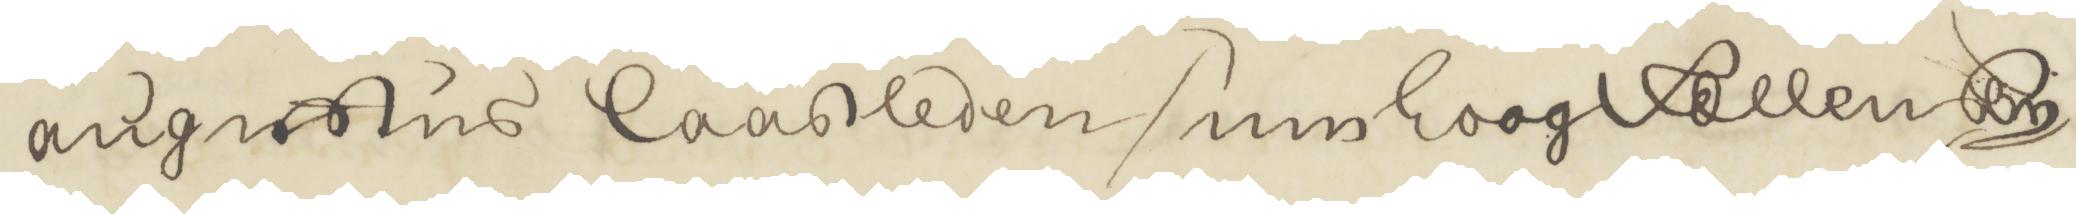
augustus laasleden / uw hoog Edelens bij
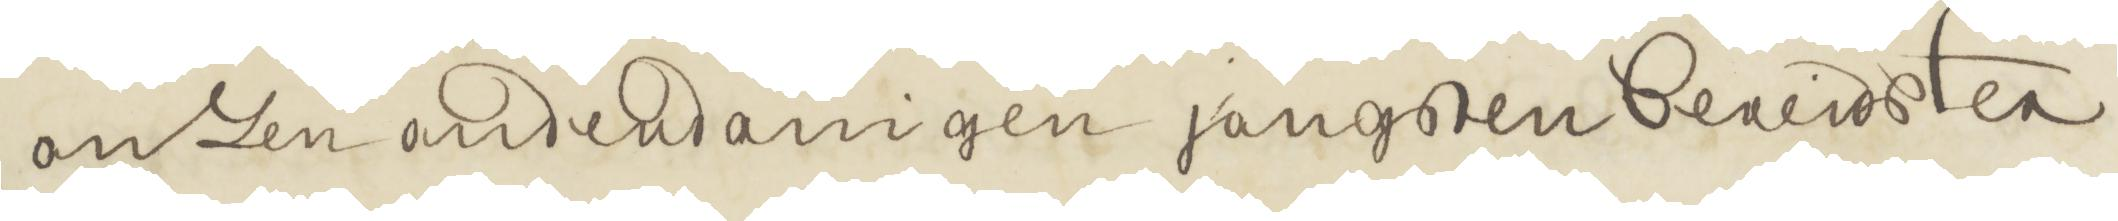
onzen anderdanigen jongsten bereidster
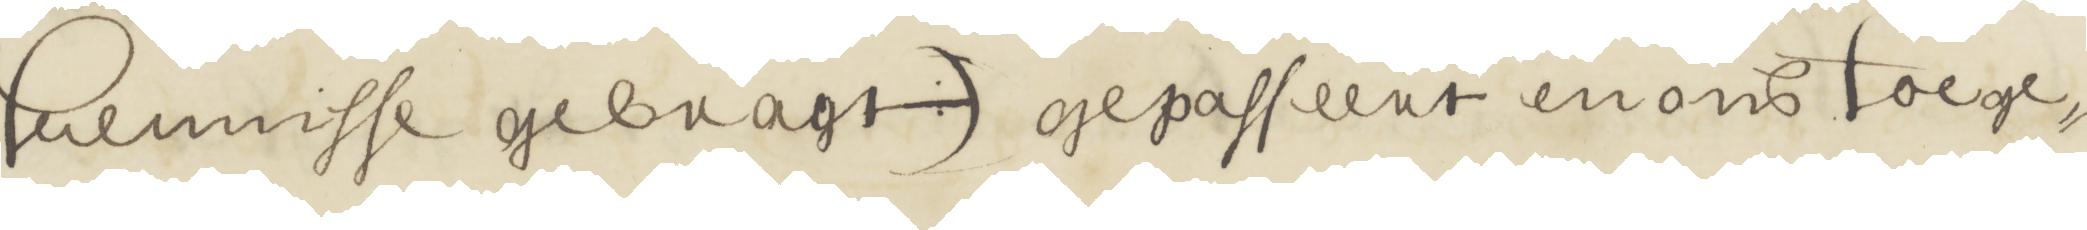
kennisse gebragt :) gepasseert en ons toege„
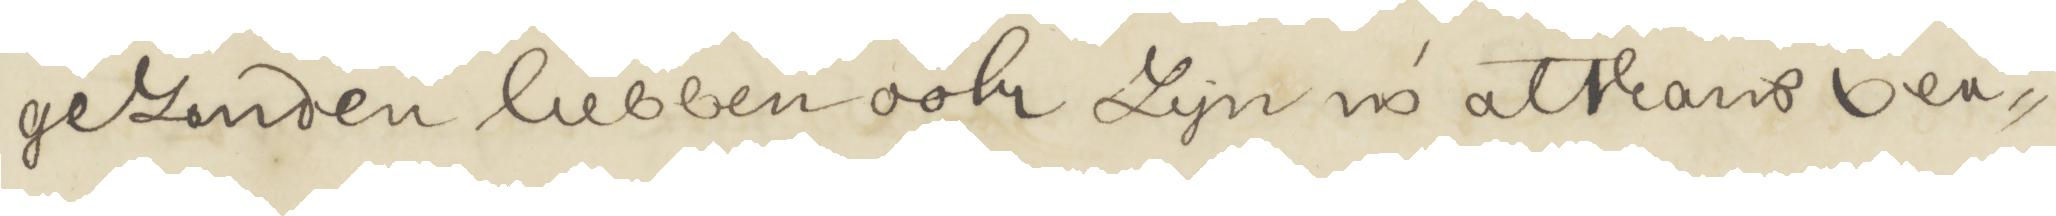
gezonden hebben ook zyn w' althans ver„
